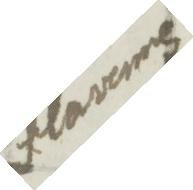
slavinnen
